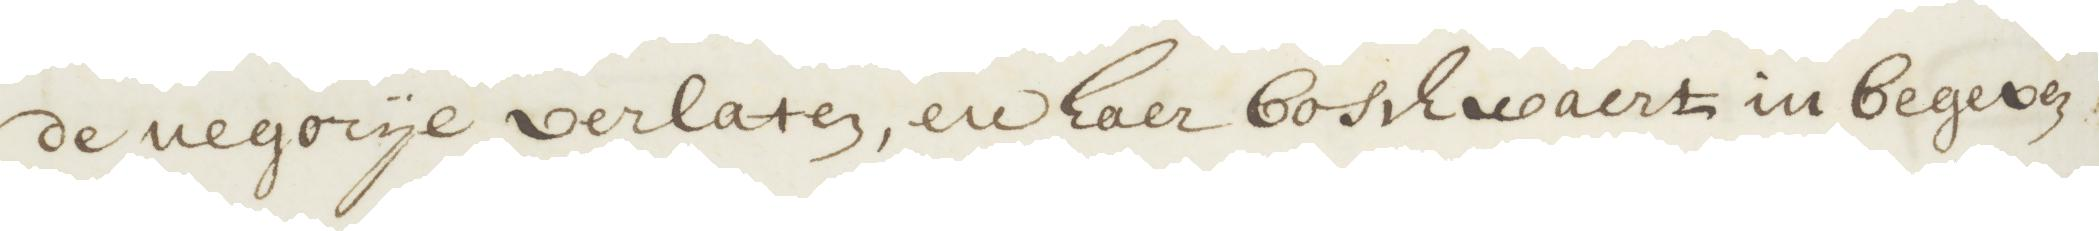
de negorije verlaten, en haer boschwaert in begeven
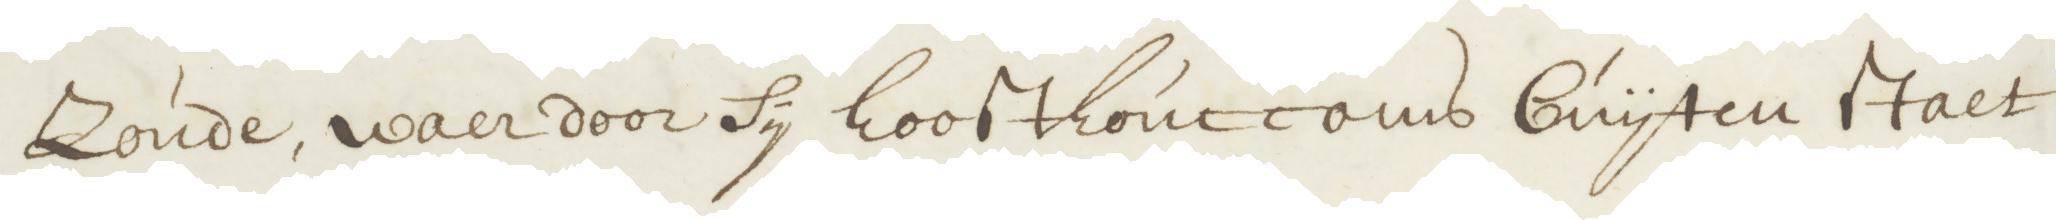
zoude, waer door sij hoofthouccoms buijten staet
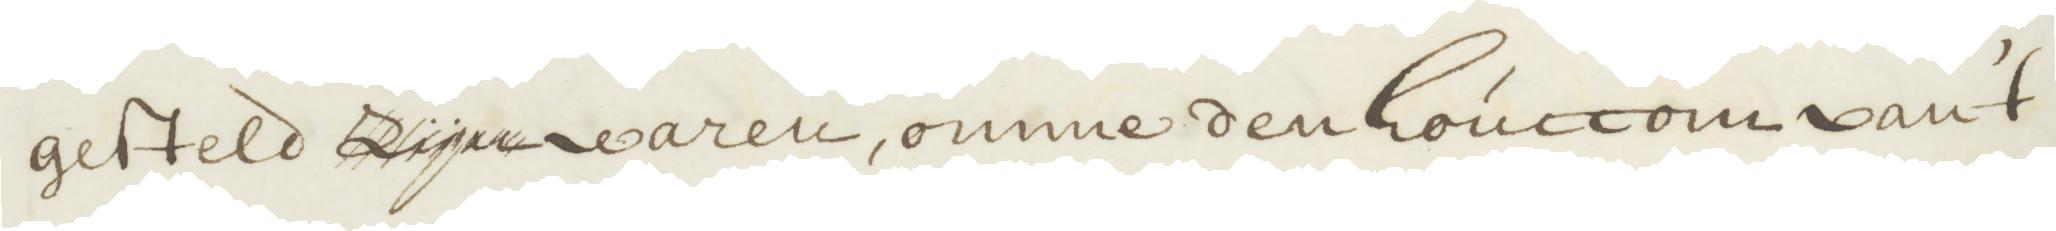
gesteld zijn waren, omme den houccom van ’t
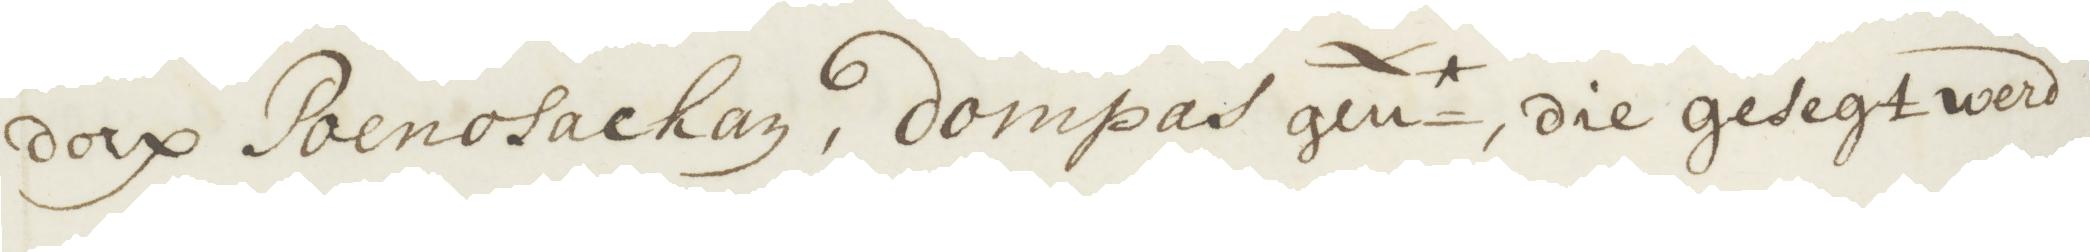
dorp Poenosackan, dompas gen=t, die gesegt werd
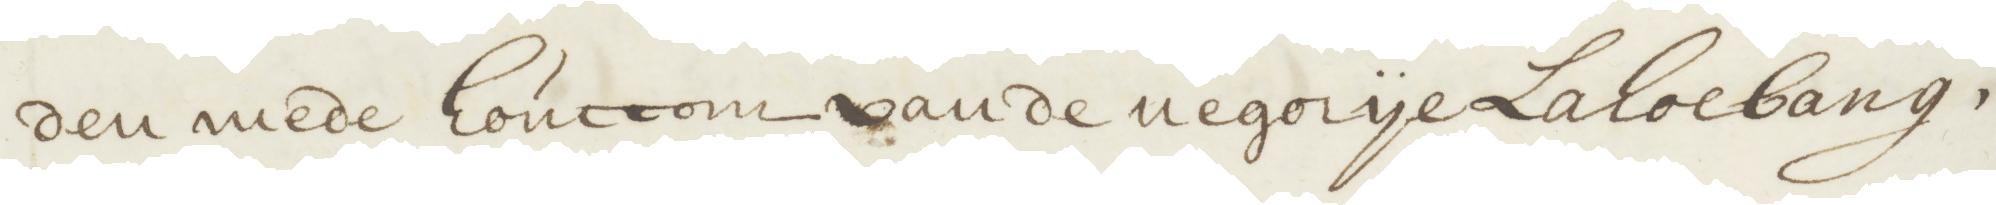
den mede houccom van de negorije Lahoebang,
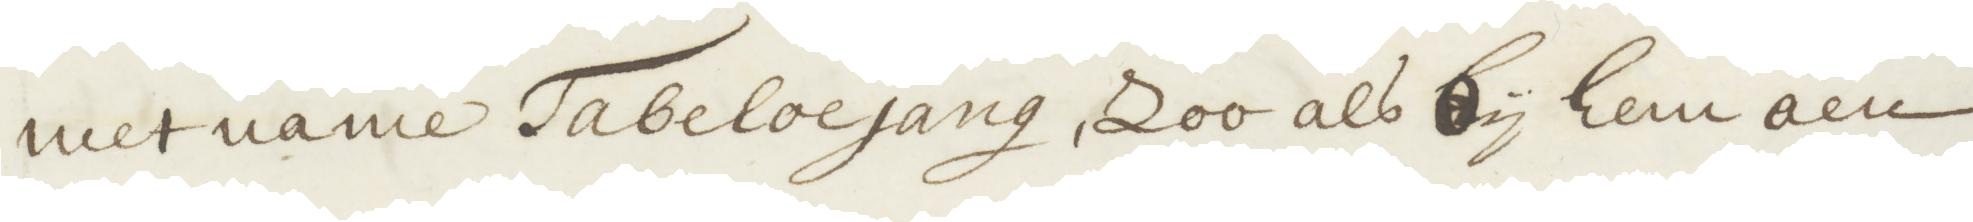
met name Tabeloejang, zoo als bij hem aen
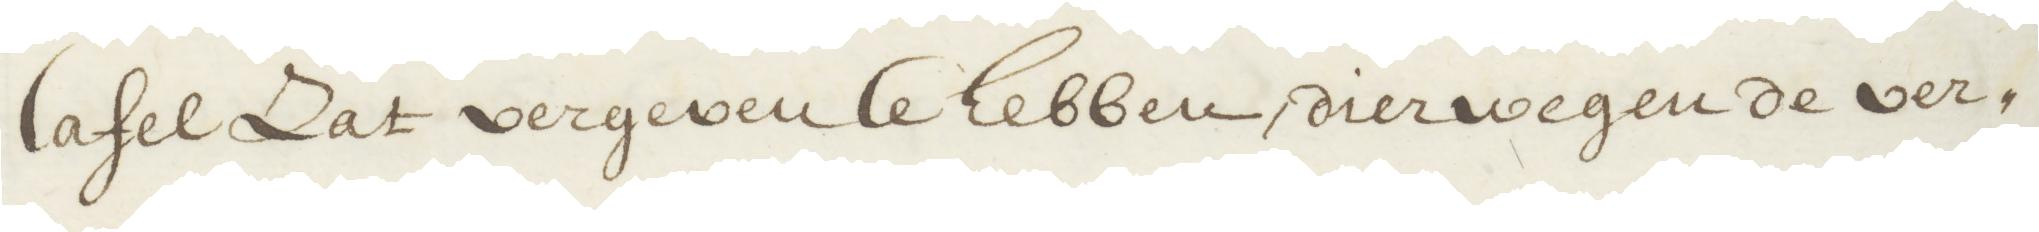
tafel zat vergeven te hebben, dierwegen de ver„
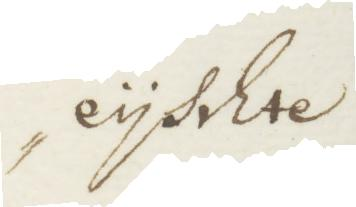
eijschte
